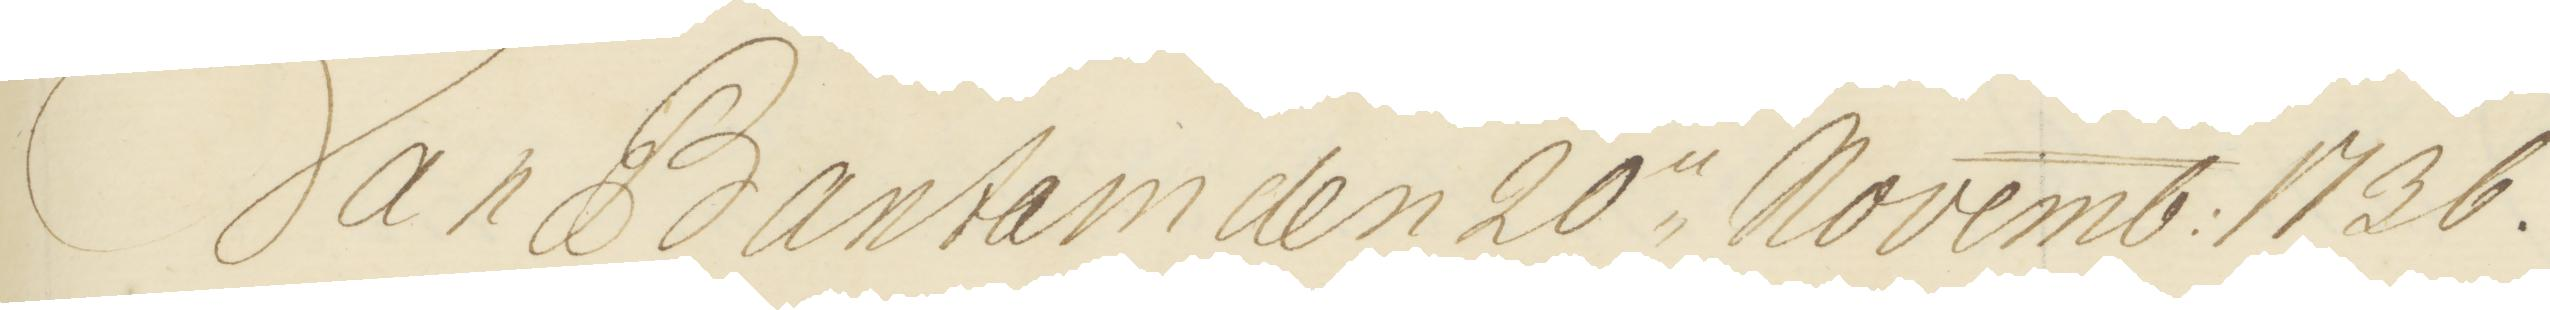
Van Bantam den 20„e Novemb: 1736.
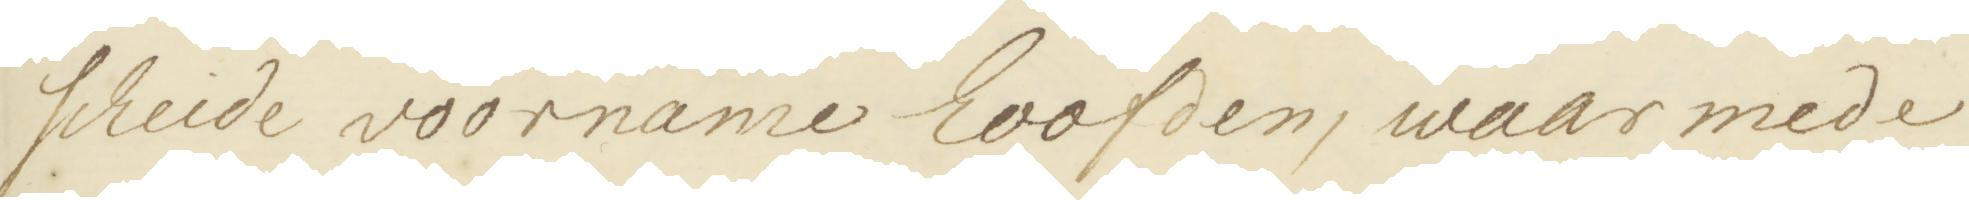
scheide voorname hoofden, waar mede
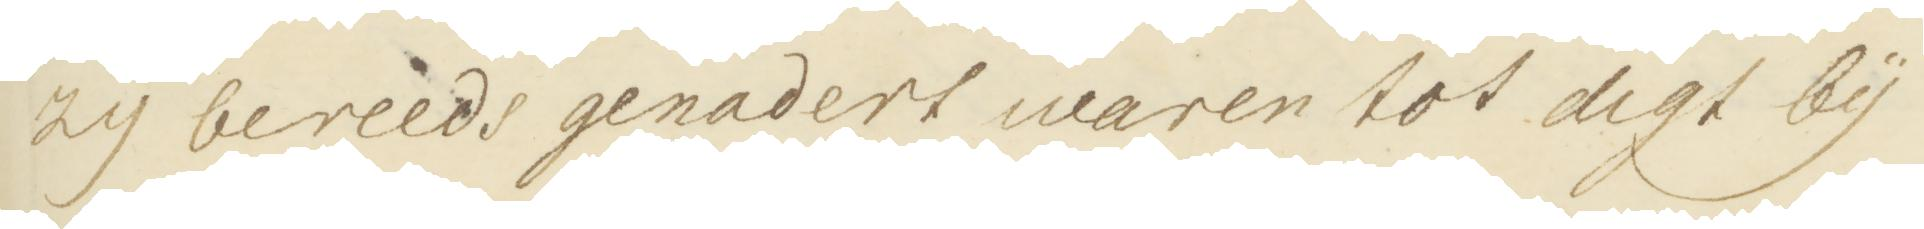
zij bereeds genadert waren tot digt bij
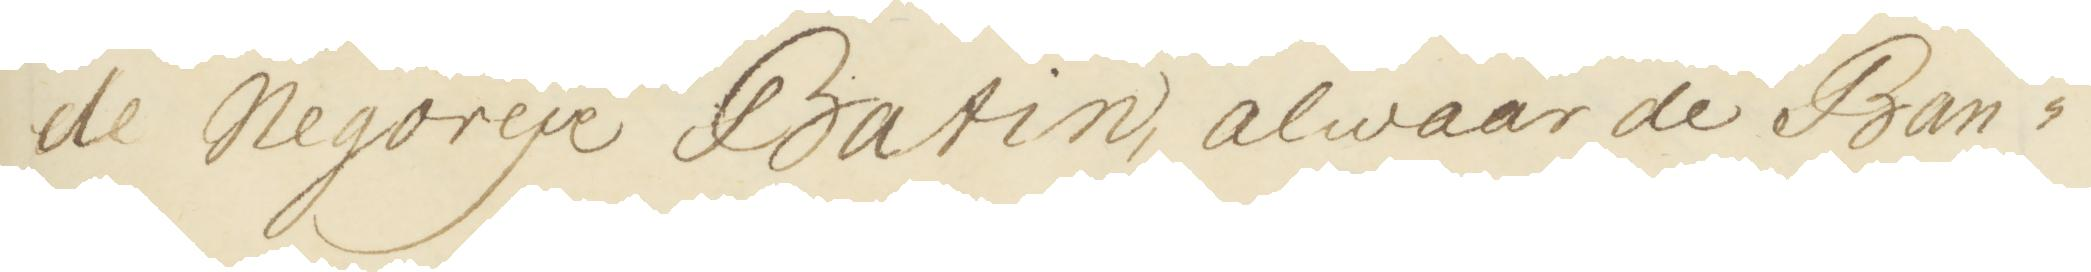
de Negorije Batin, alwaar de Ban„
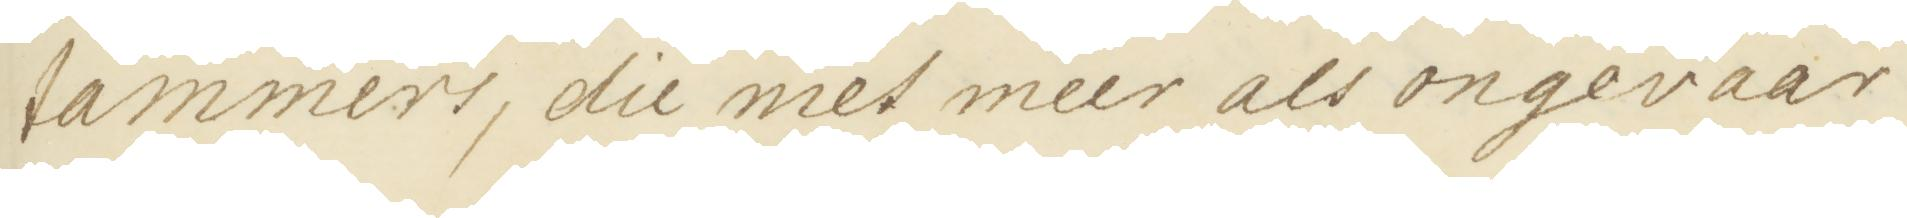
tammers, die niet meer als ongevaar
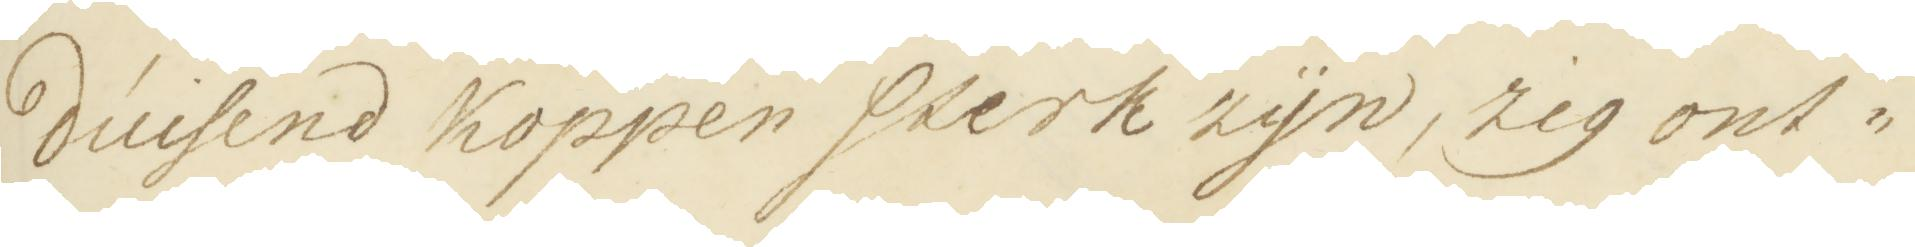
duisend koppen sterk zijn, zig ont„
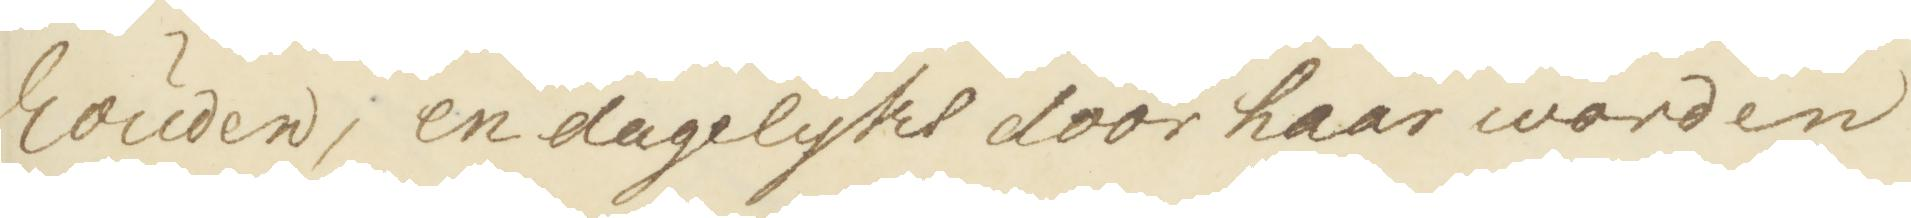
houden; en dagelyks door haar worden
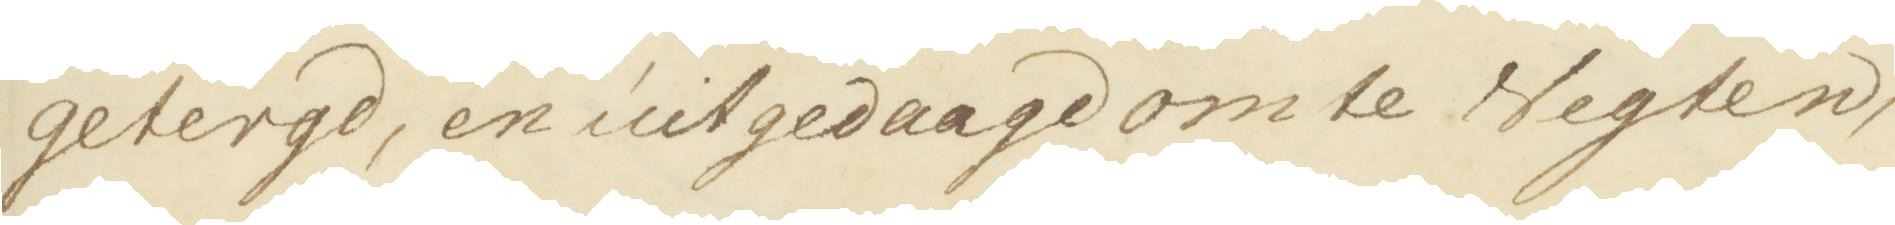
getergd, en uit gedaagd om te Vegten,
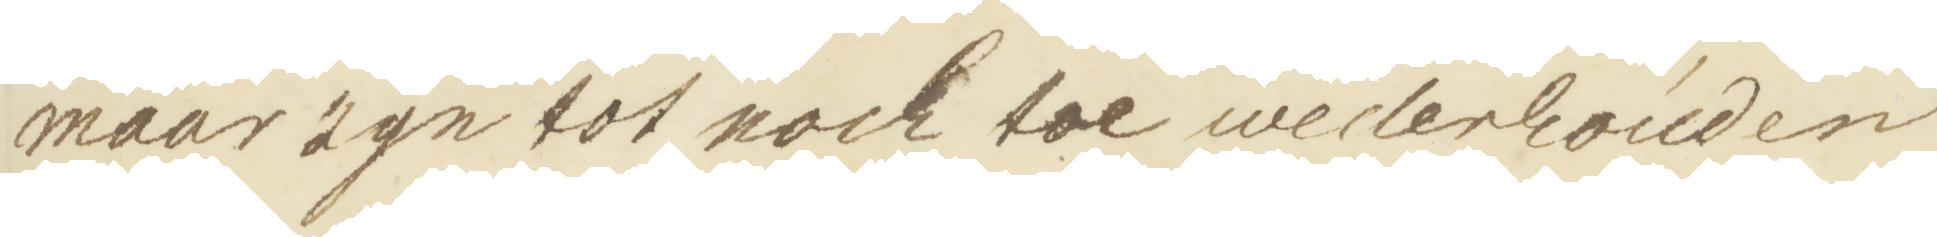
maar zijn tot noch toe wederhouden
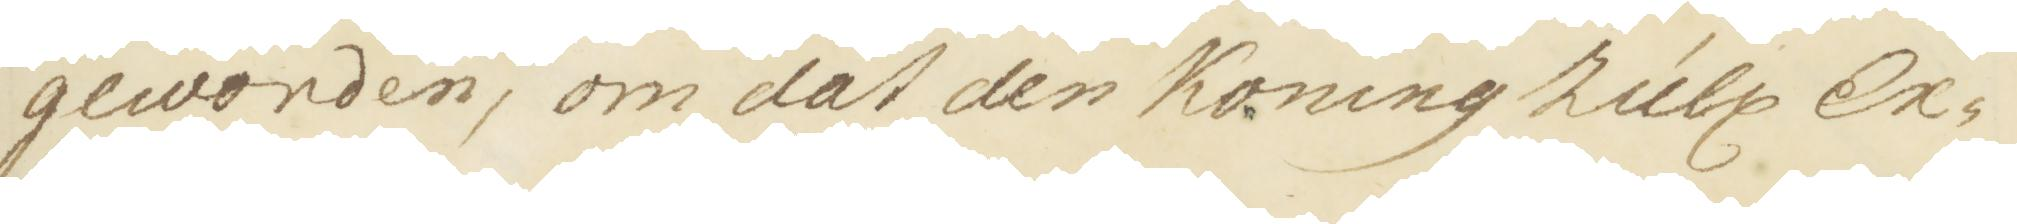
geworden, om dat den koning zulx Ex„
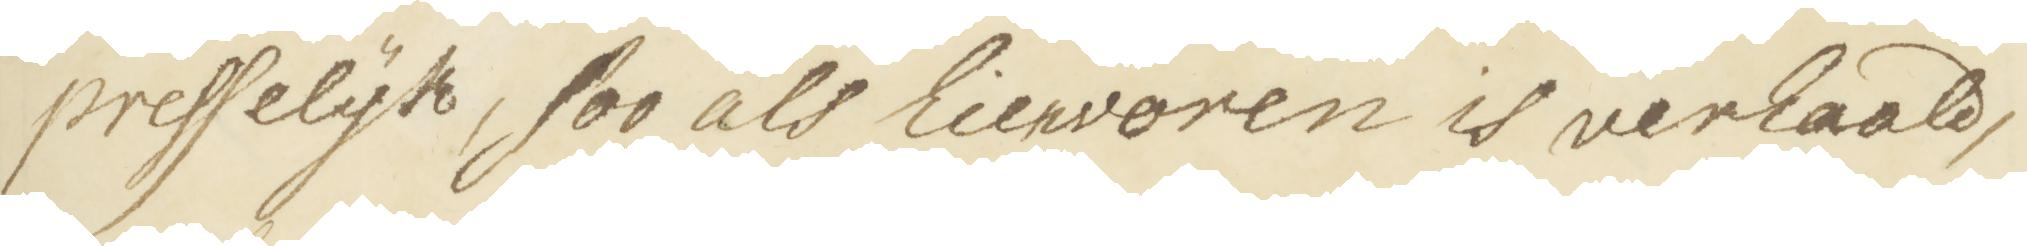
presselijk, Soo als hiervoren is verhaald,
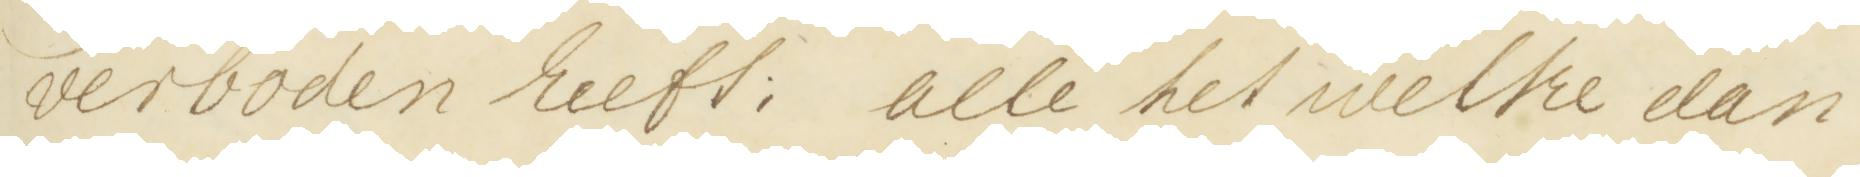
verboden heeft: alle het welke dan
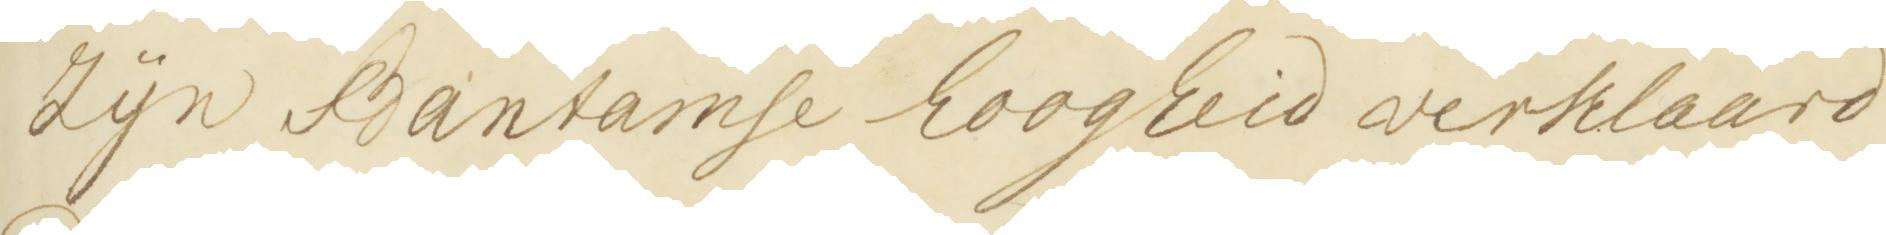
Zijn Bantamse hoogheid verklaard
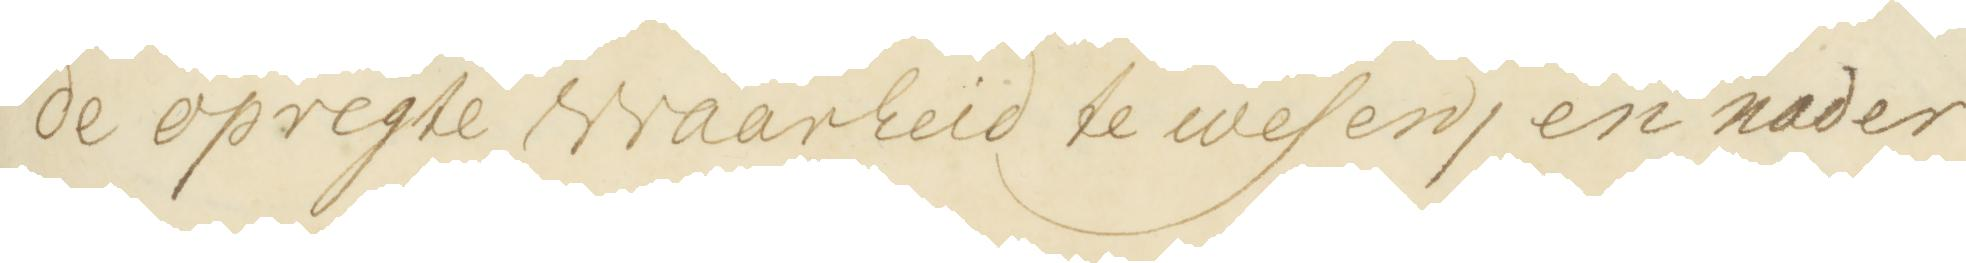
de opregte waarheid te wesen, en nader
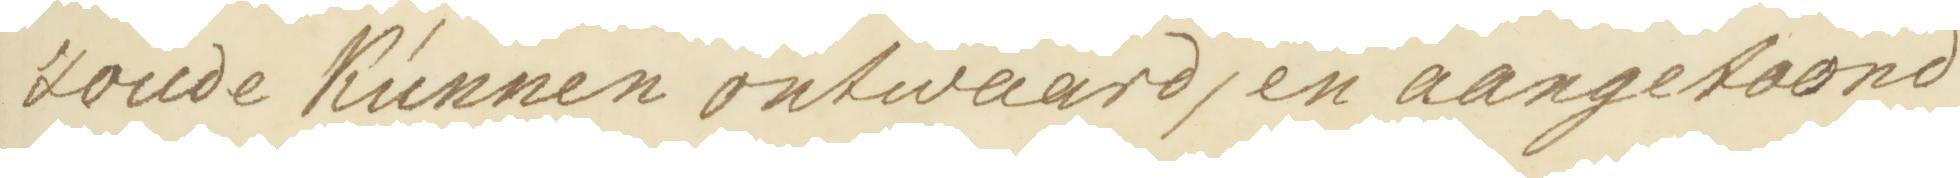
zoude Kunnen ontwaard, en aangetoond
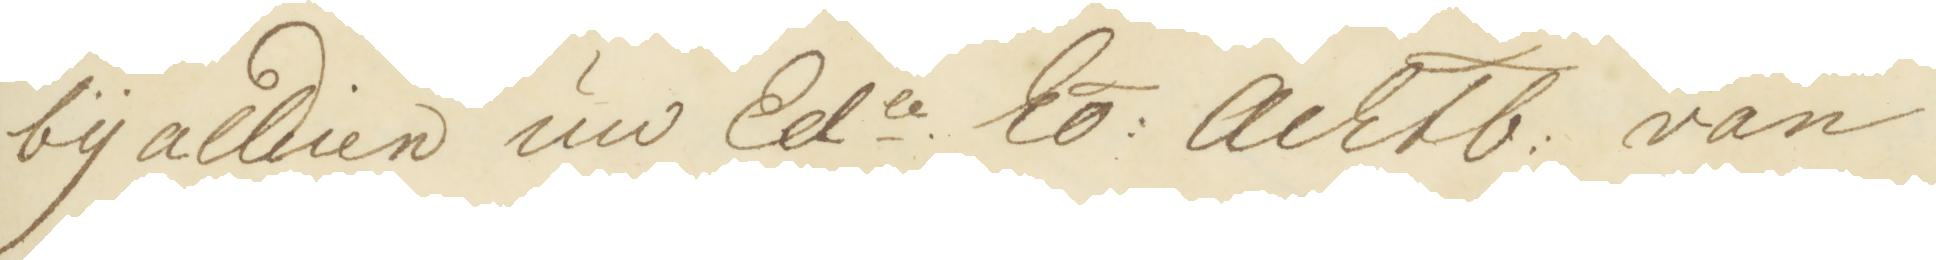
bij alldien uw Ed-le. Ed: Achtb: van
